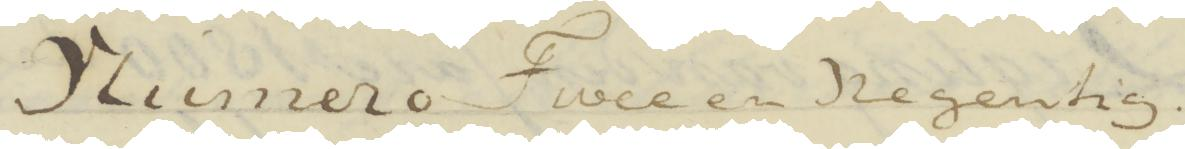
Numero Twee en Negentig.
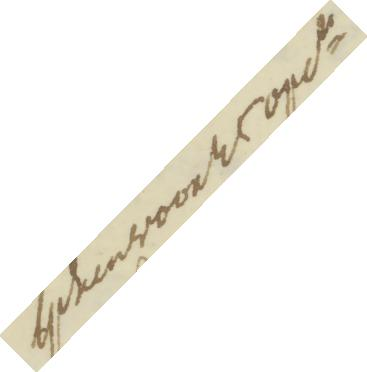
gesien voort Cope=do
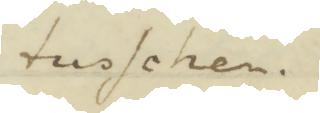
tusschen.
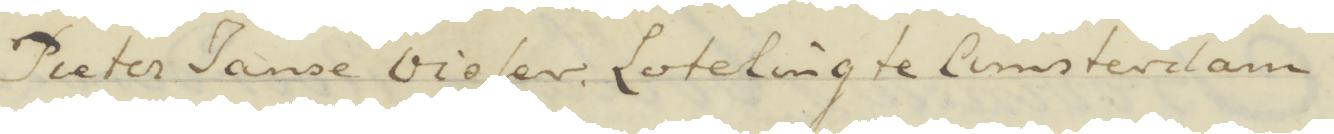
Pieter Janse visser. Loteling te Amsterdam
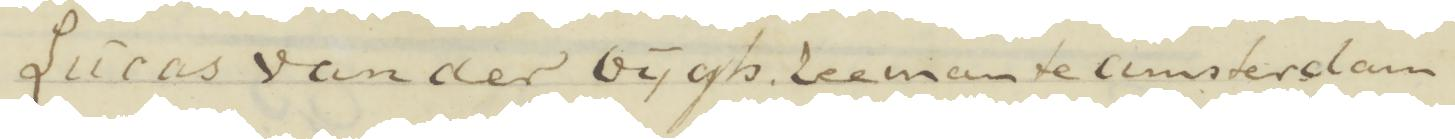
Lucas van der Oijgh. zeeman te Amsterdam
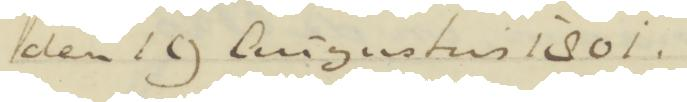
den 19 Augustus 1801.
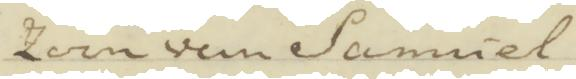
zoon van Samuel
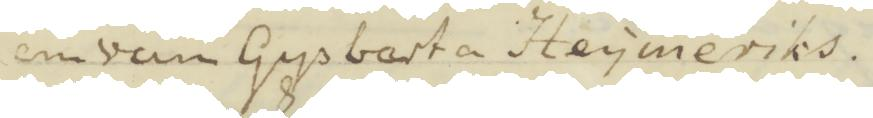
en van Gysberta Heijmeriks.
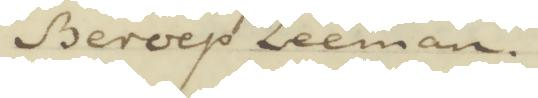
Beroep zeeman.
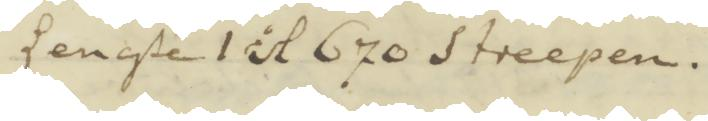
Lengte 1 El 670 Streepen.
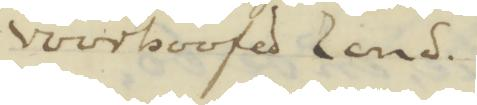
voorhoofd rond.
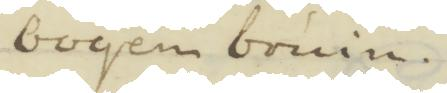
Oogen bruin.
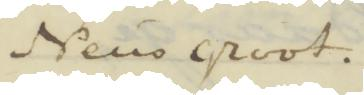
Neus groot.
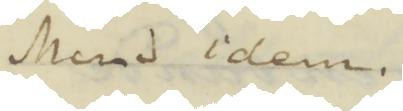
Mond idem.
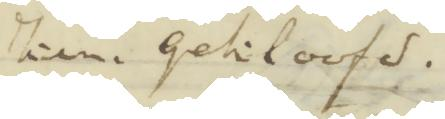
Kin gekloofd.
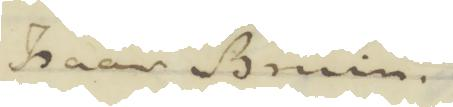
Haar Bruin.
